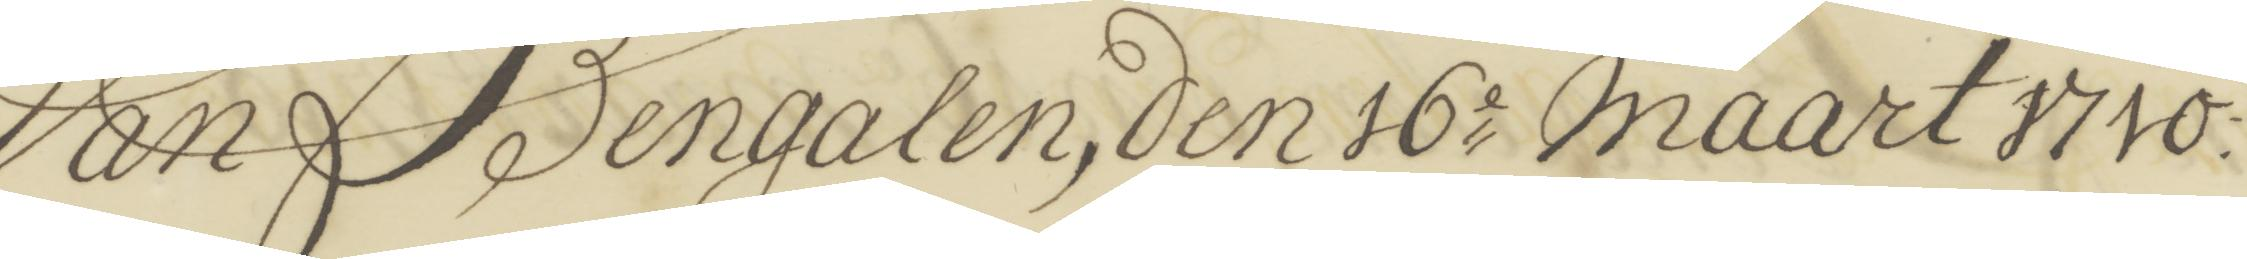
Van Bengalen, den 16„e Maart 1710:.
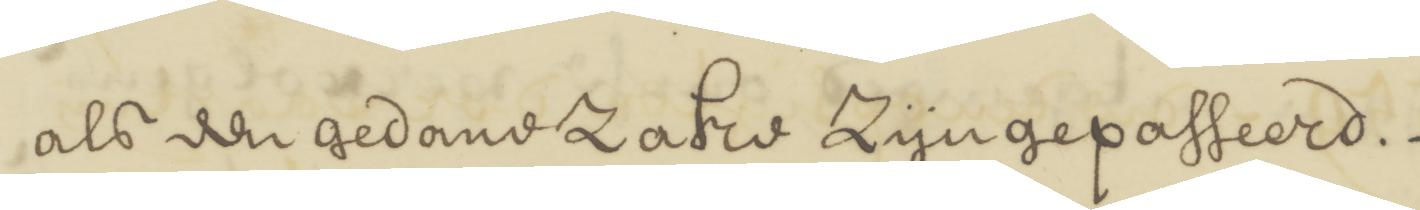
als een gedane zake zijn gepasseerd.
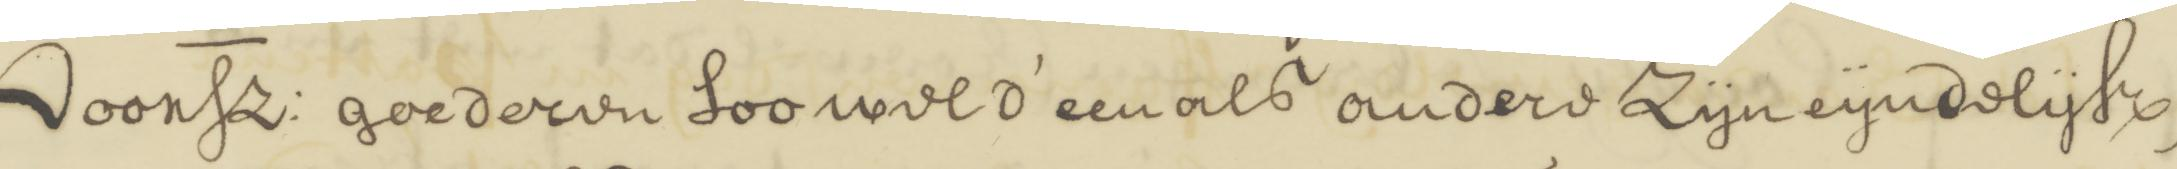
Voorsz: goederen soo wel d’ een als andere zijn eijndelijk,
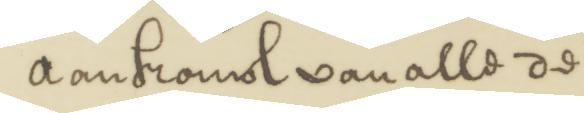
aankomst van alle de
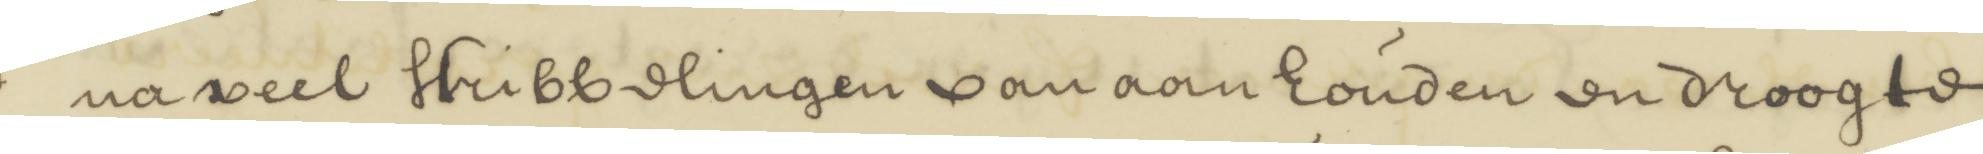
na veel stribbelingen van aan houden en droogte
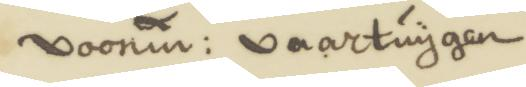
voorm: vaartuijgen
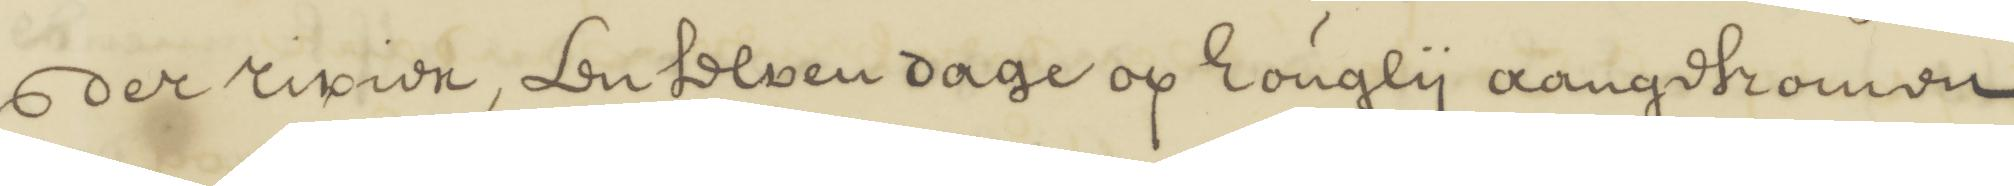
der rivier, ten selven dage op houglij aangekomen
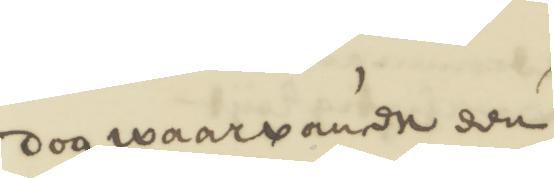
dog waarvan'er een
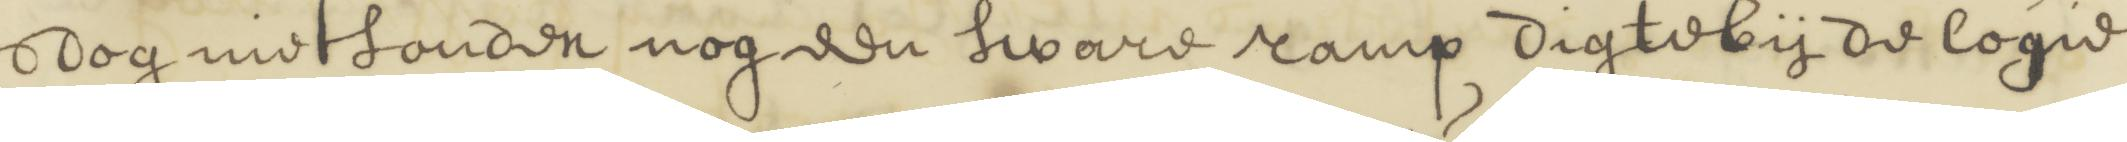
dog niet sonder nog een sware ramp digtebij de logie
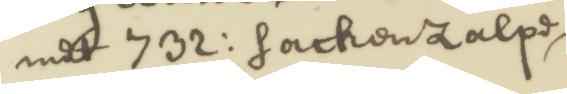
met 732: sackenzalpe
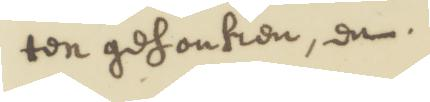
ter gesonken, en.
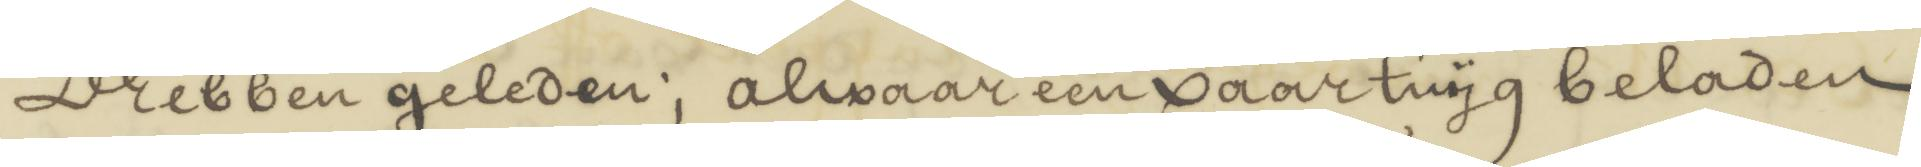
te hebben geleden; alwaar een vaartuijg beladen
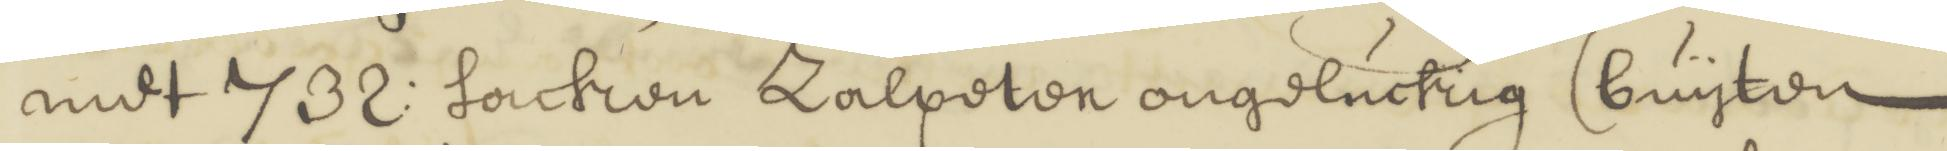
met 732: sacken zalpeter ongeluckig (buijten
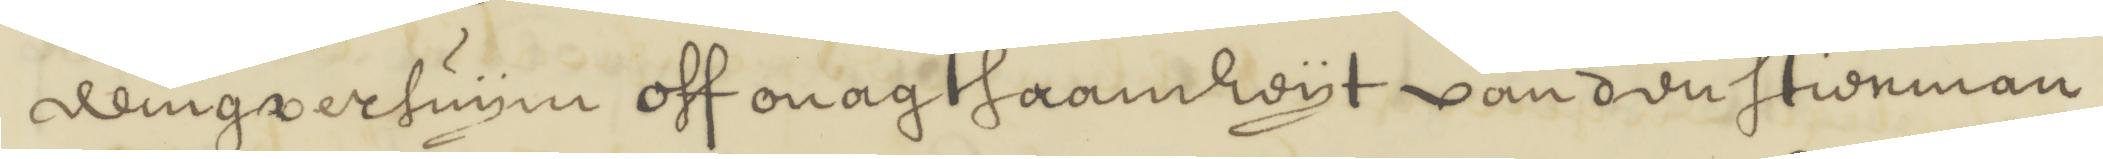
eenig versuijm off onagtsaamheijt van den stierman
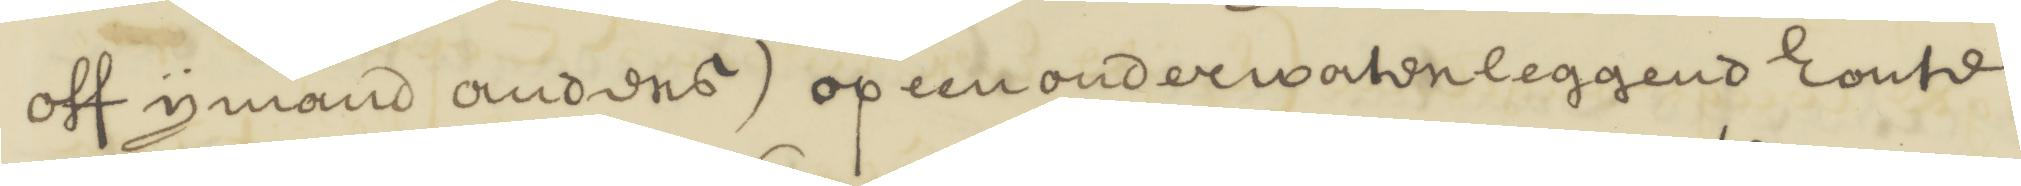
off ijmand anders) op een onderwaterleggend houte
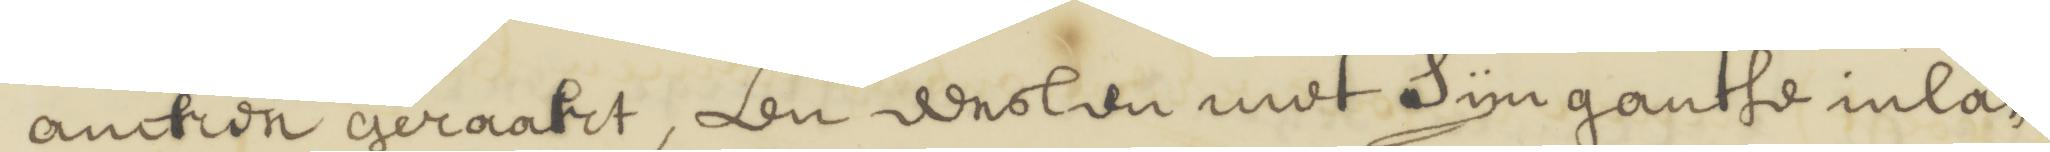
ancker geraakt, ten eersten met sijn gantse inla„
